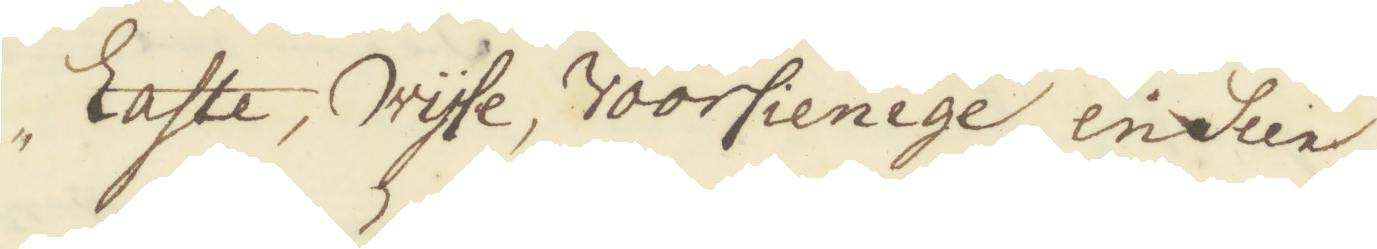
„hafte, wijse, voorsienige, en seer
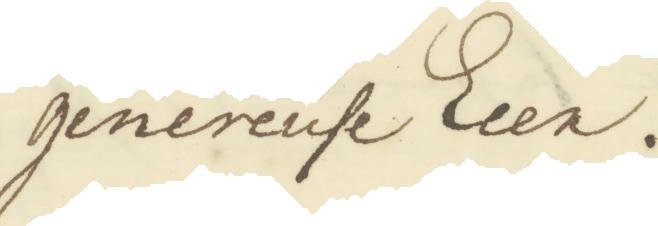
genereuse heer
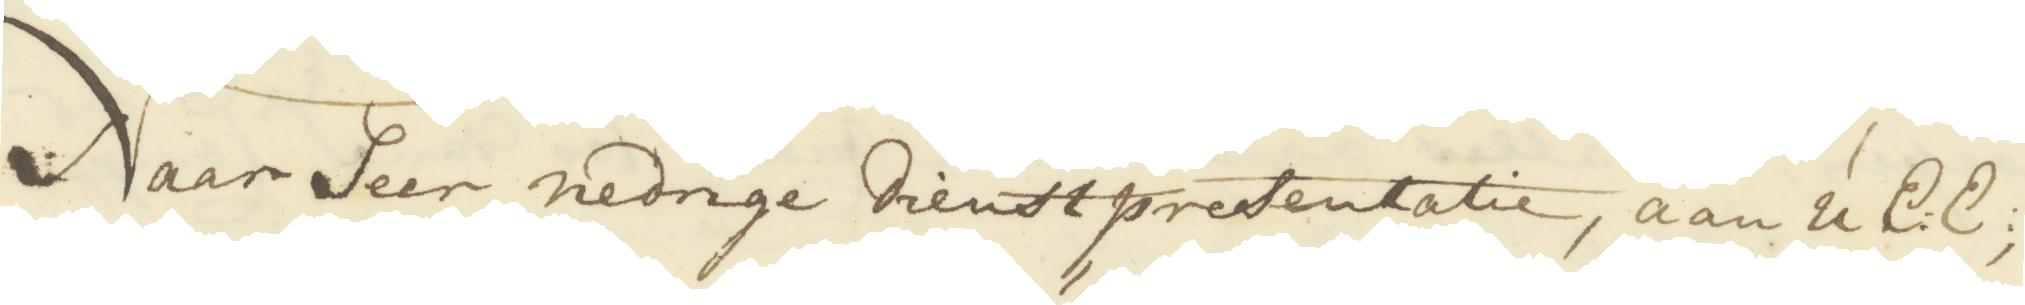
Naar seer nedrige dienst presentatie, aan u E:E
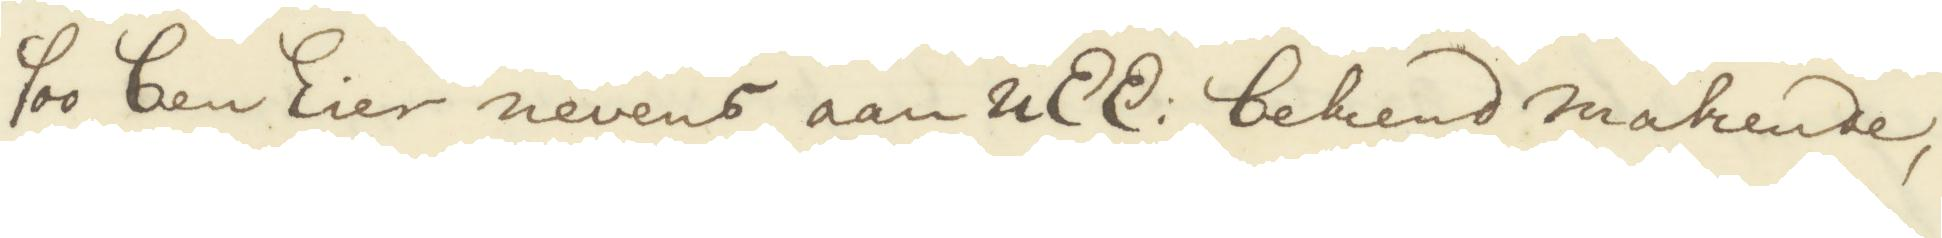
soo ben hier nevens aan uEE: bekend makende,
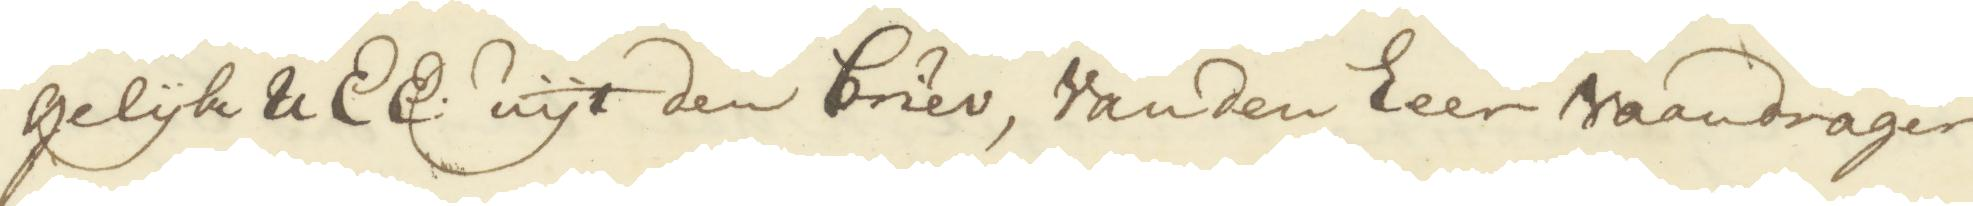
gelijk uEE: uijt den briev, van den heer vaandrager
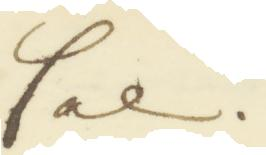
sal.
